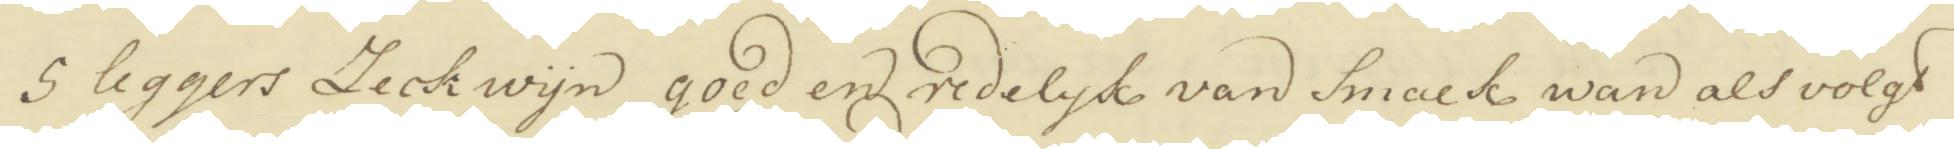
5 leggers Zeckwijn goed en redelijk van Smaek wan als volgt
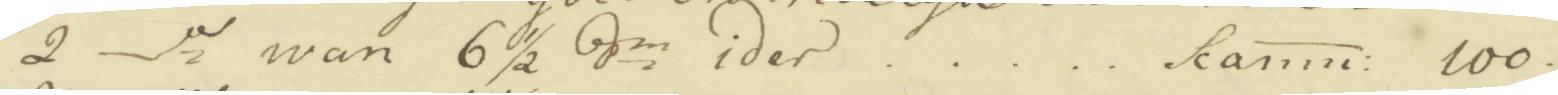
2 d„o wan 6½ d=m ider . . . . . kanm: 100.
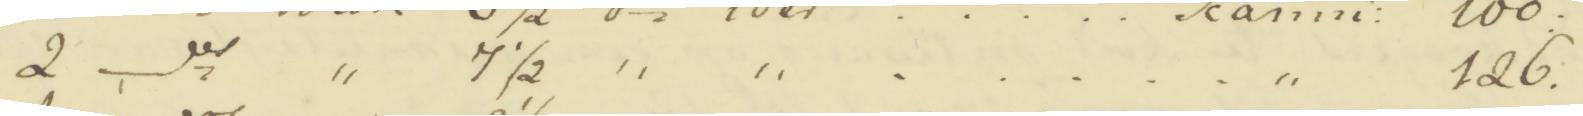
2 d„o „ 7½ „ „ . . . . . „ 126.
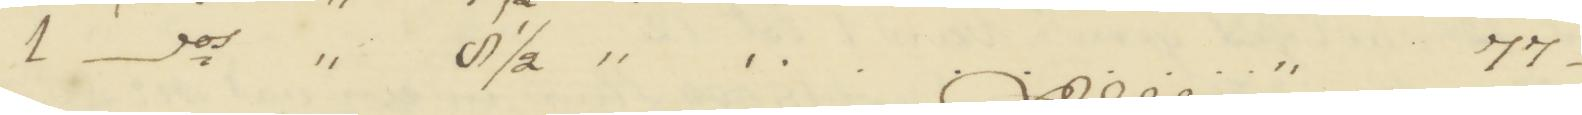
1 d=os „ 8½ „ „ . . . . . . . „ 77
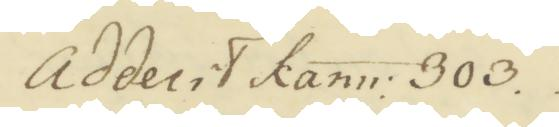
Addeert kann: 303.
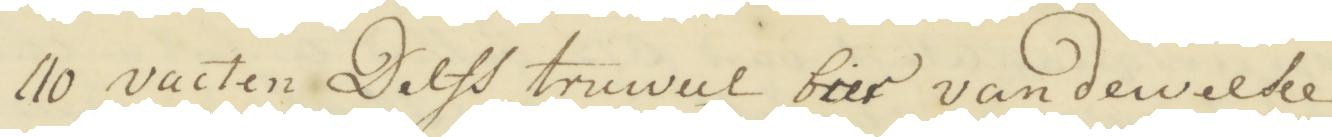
40 vaeten Delfs truweel bier van dewelke
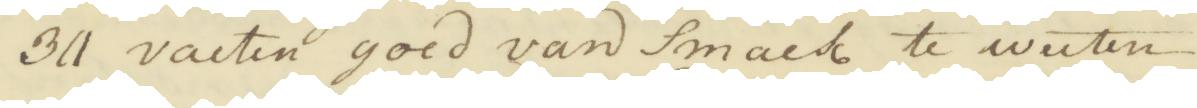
34 vaeten goed van Smaek te weeten
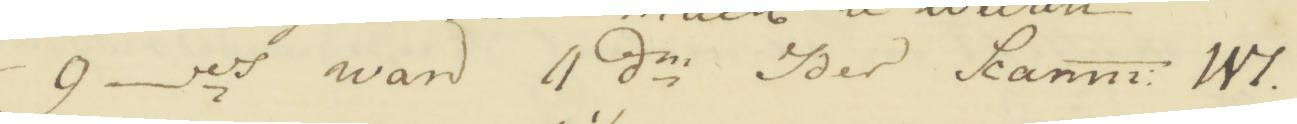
9 d_os wan 4 d=m Ider kanm: 117.
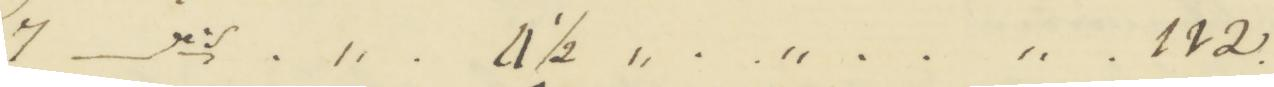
7 d=os . „ . 4½ „ . .„ . . „. 112.
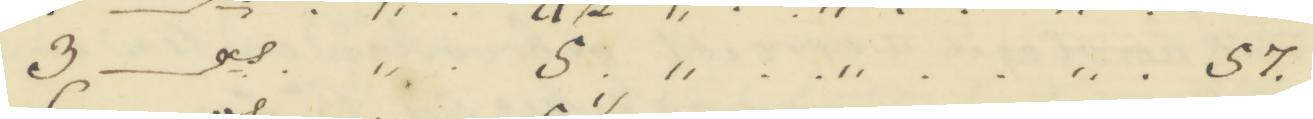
3 d:os. „ . 5. „ . . „ . .„ . 57.
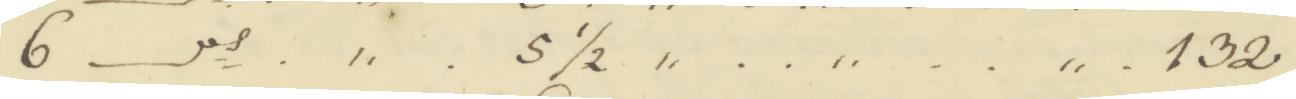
6 d=os . „ .5½ „ . . „ . . „ . 132.
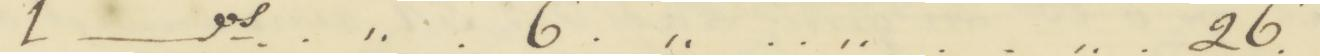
1 d=os . . „ . 6 . „ . . „ . . „ . 26.
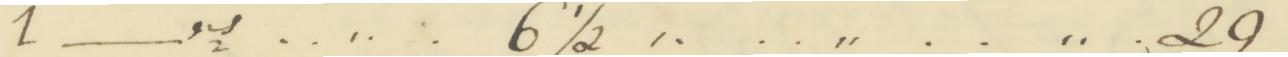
1 d=os . . „ . 6½ „ . . „ . . „ . 29
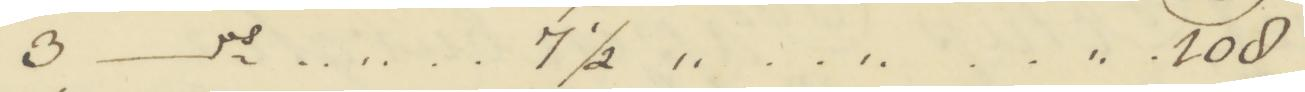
3 d: os . . „ . . 7½ „ . . „ . . „ . 108
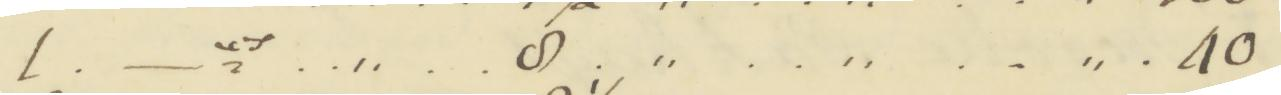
1. d=os . . „ . . 8. „ . . „. - „ . 40
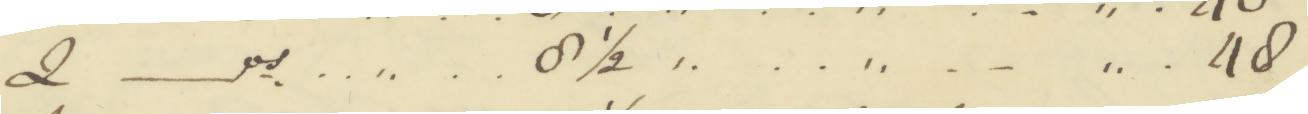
2 d=os . . „ . . 8½ „ . . „ . - „ . 48
